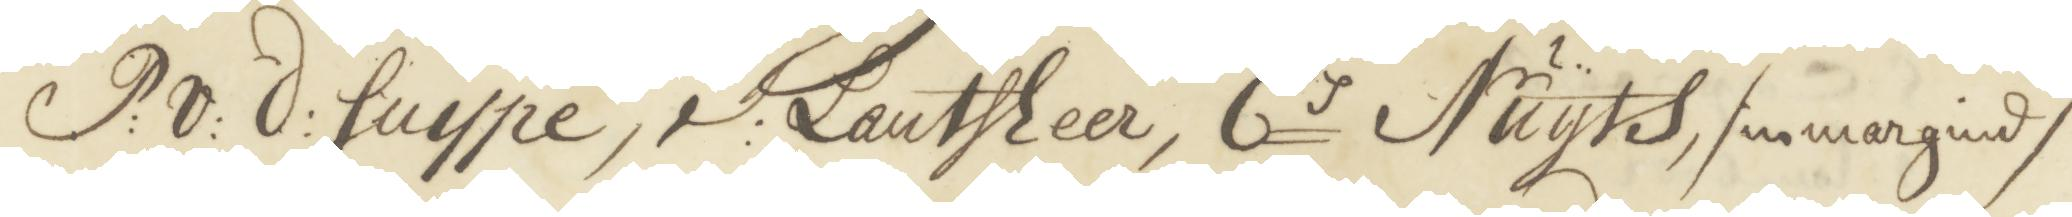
P: v: d: snippe, I: Lantsheer, E=s Nuijts, /in margine/
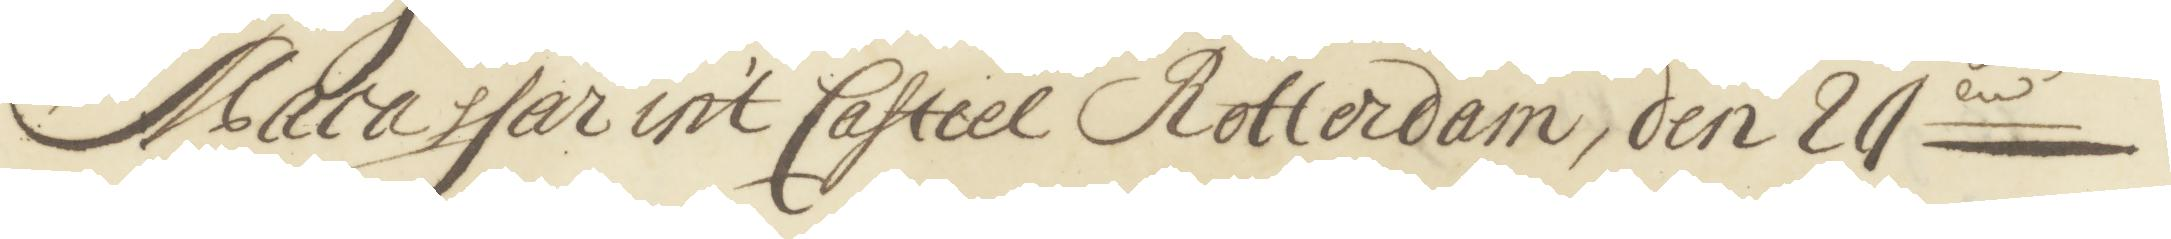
Macassar in ’t Casteel Rotterdam, den 24=en
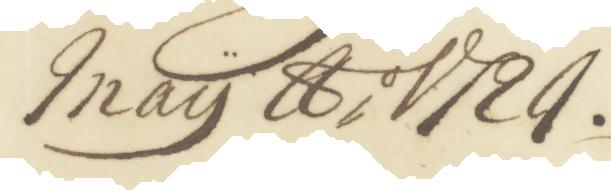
Maij A„o 1724.
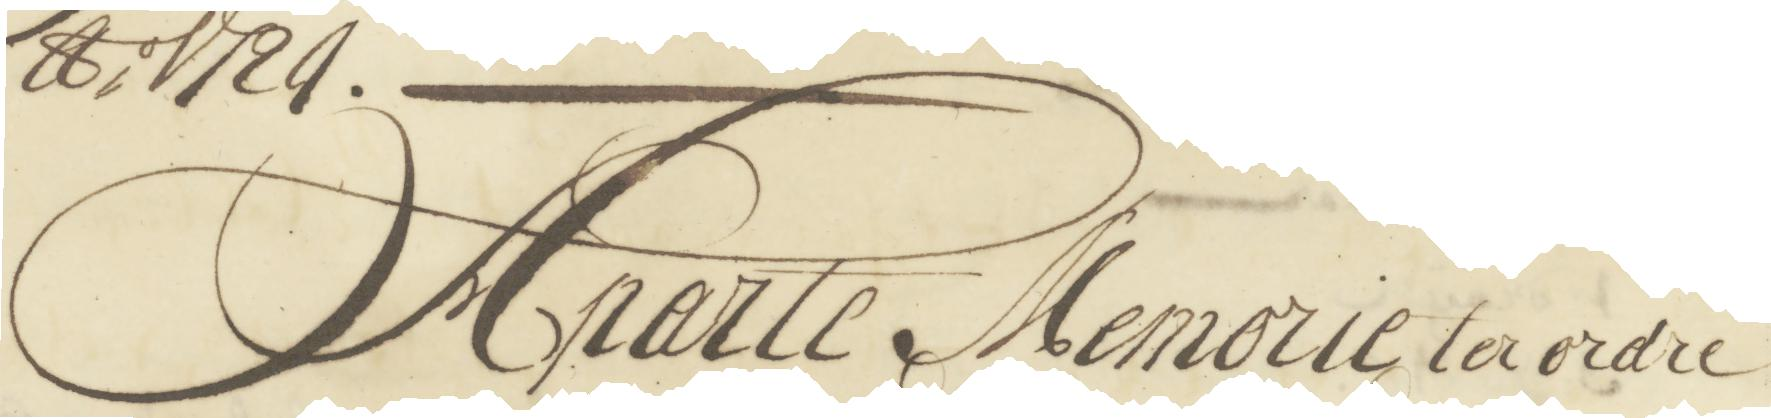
Aparte Memorie ter ordre
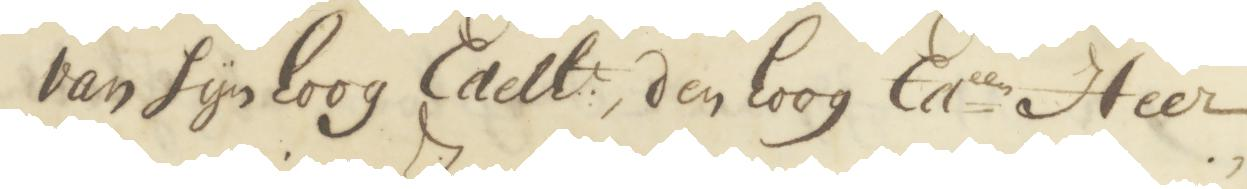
van sijn hoog Edelh:t, den hoog Ed=le Heer
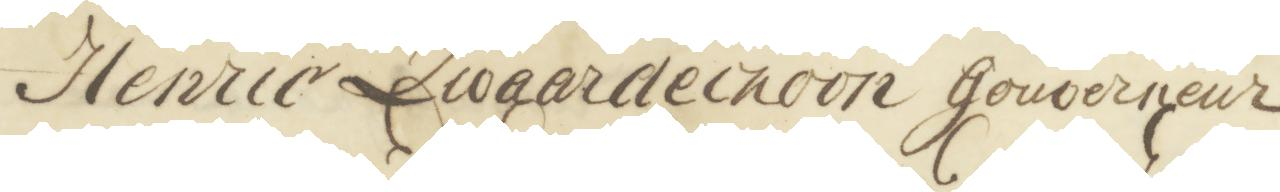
Henric Zwaardecroon Gouverneur
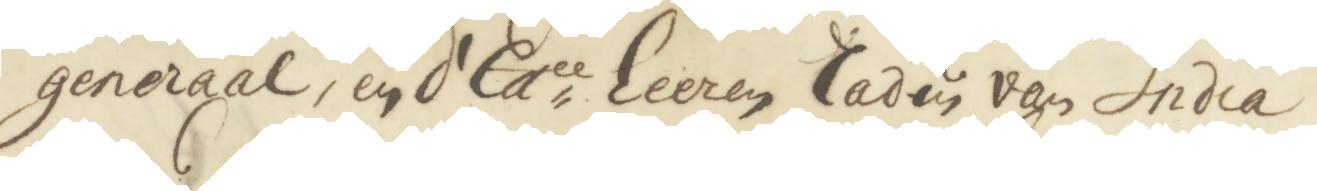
generaal, en d’ Ed„le heeren Raden van India
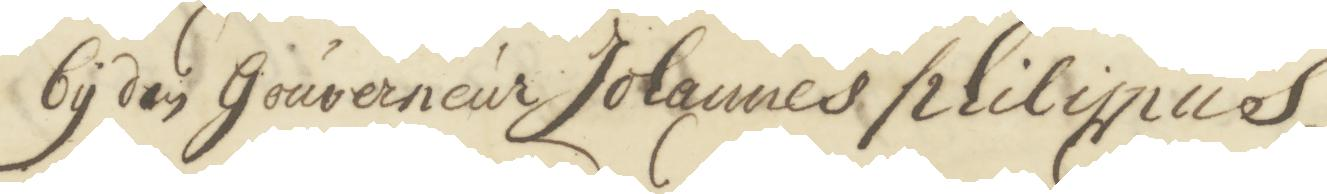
bij den Gouverneur Johannes Philippus
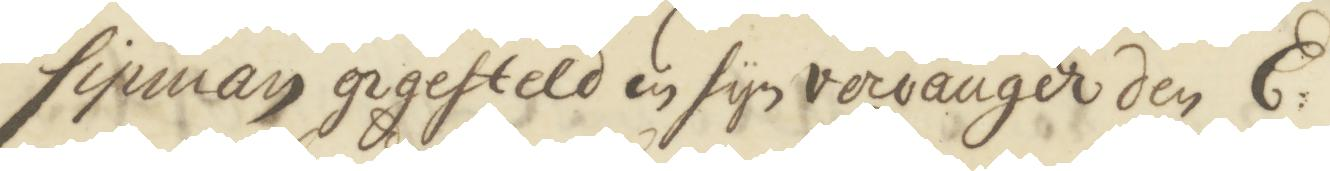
Sipman opgesteld en sijn vervanger den E:
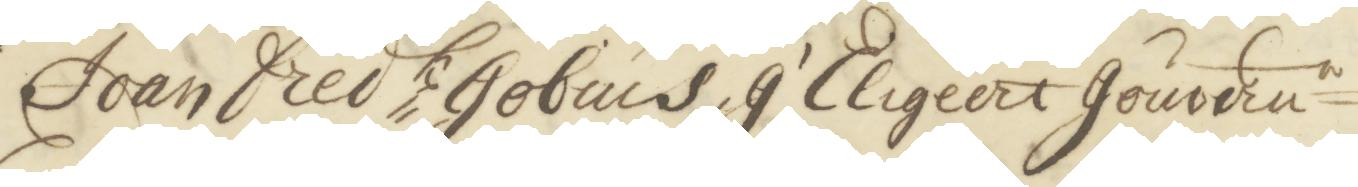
Ioan Fred„k Gobius, g’ Eligeert Gouvern=r
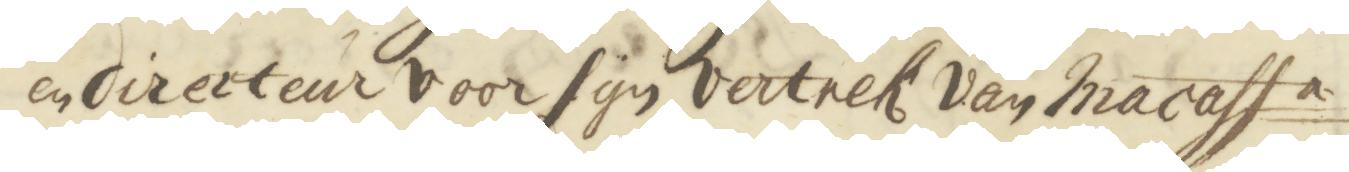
en directeur voor sijn vertrek van macass=r
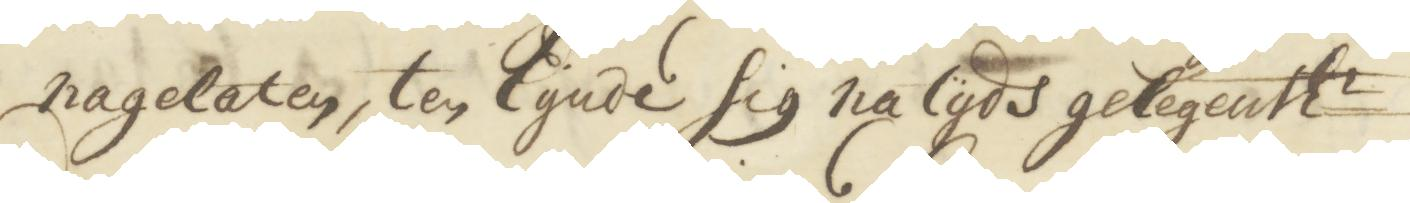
nagelaten, ten Eijnde sig na tijds gelegenth=t
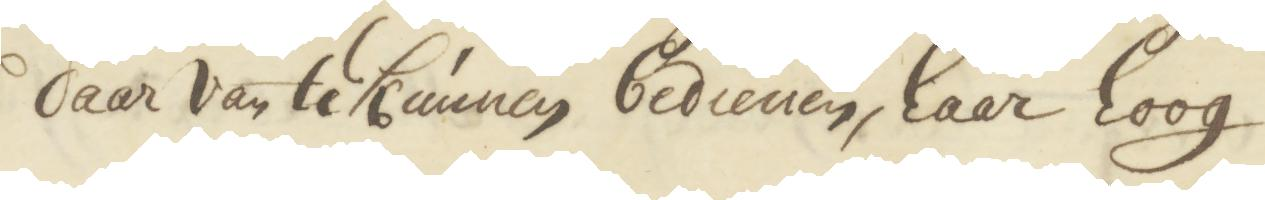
daar van te kunnen bedienen, haar hoog
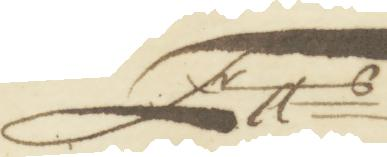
Ed=s
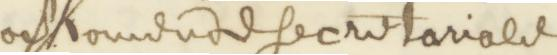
overkomende secretariale
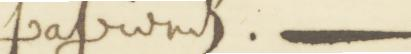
papieren. —
